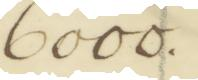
6000.
